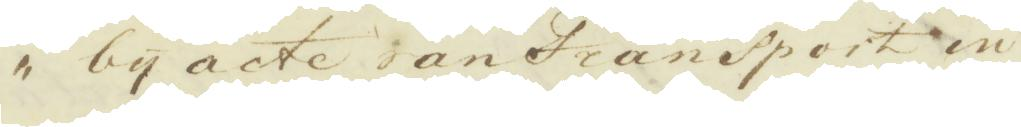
„ bij acte van Transport in
